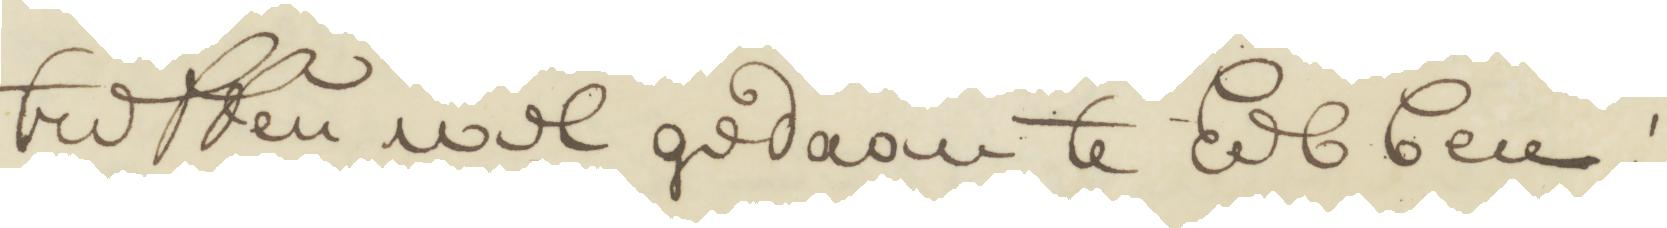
treffen wel gedaan te hebben;
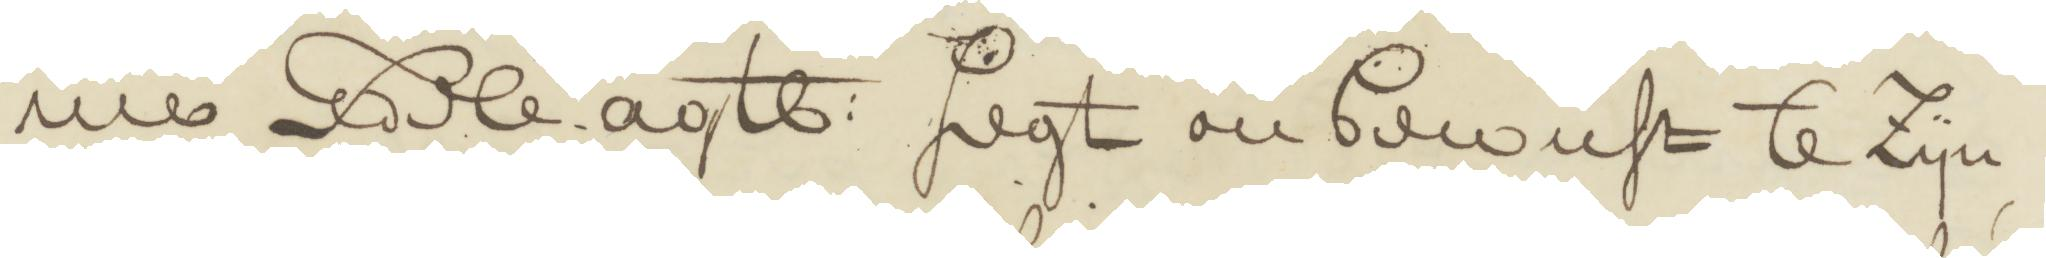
uw Edele agtb: segt onbewust te zijn
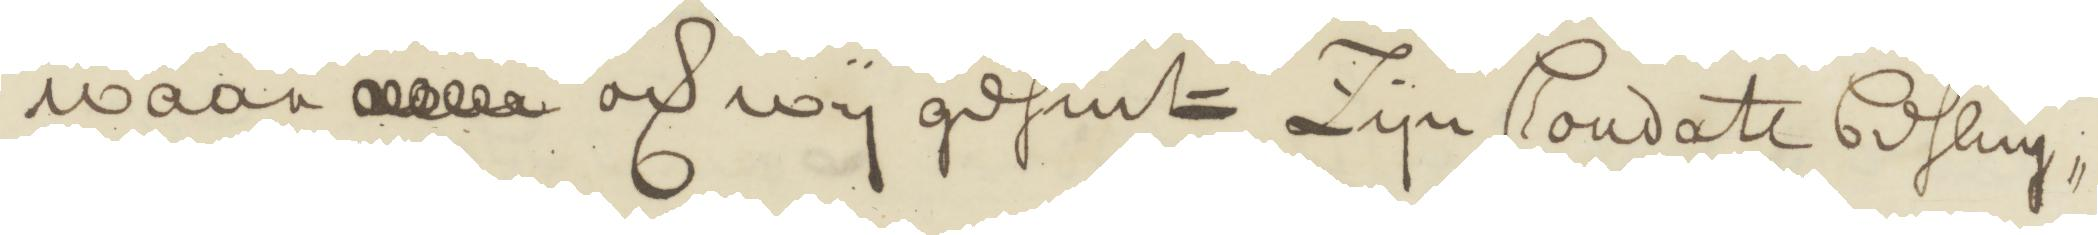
waar om over wij gesint zijn Cordate besluij„
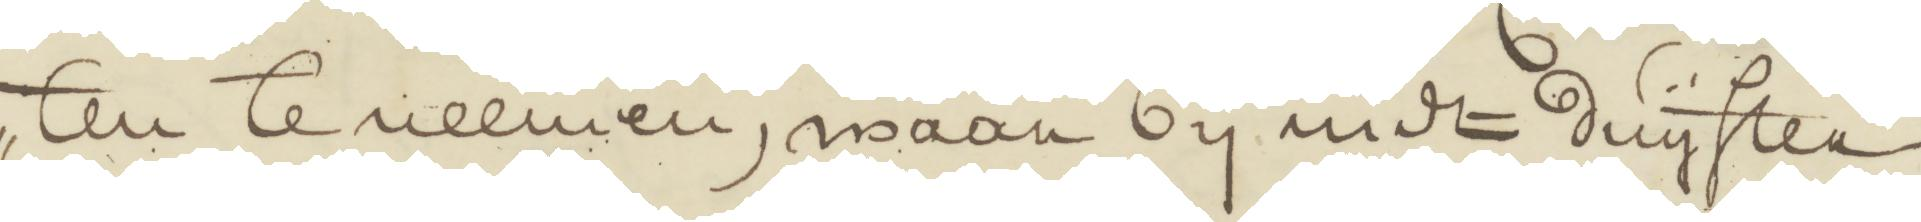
„ten te neemen, waar bij niet duijster
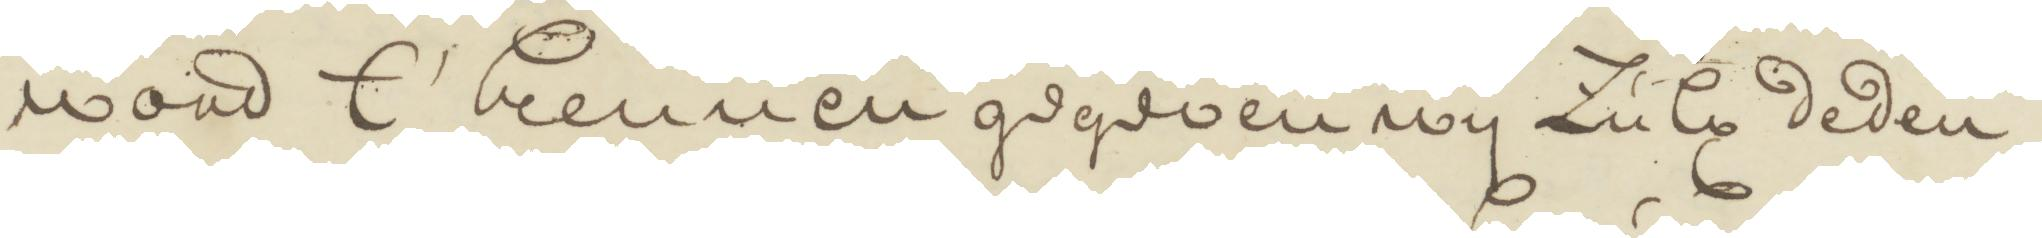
word t'kennen gegeven wij zulx deden
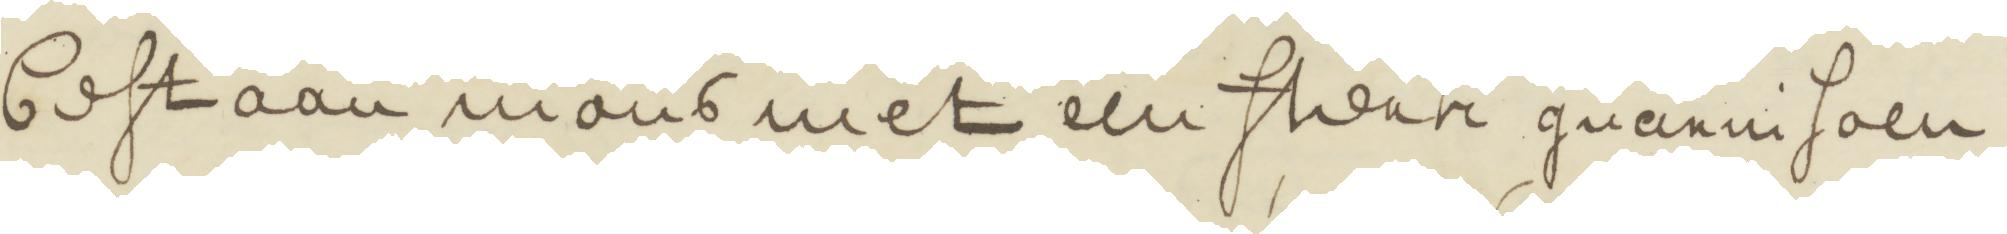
best aan in ons met een sterk guarnisoen
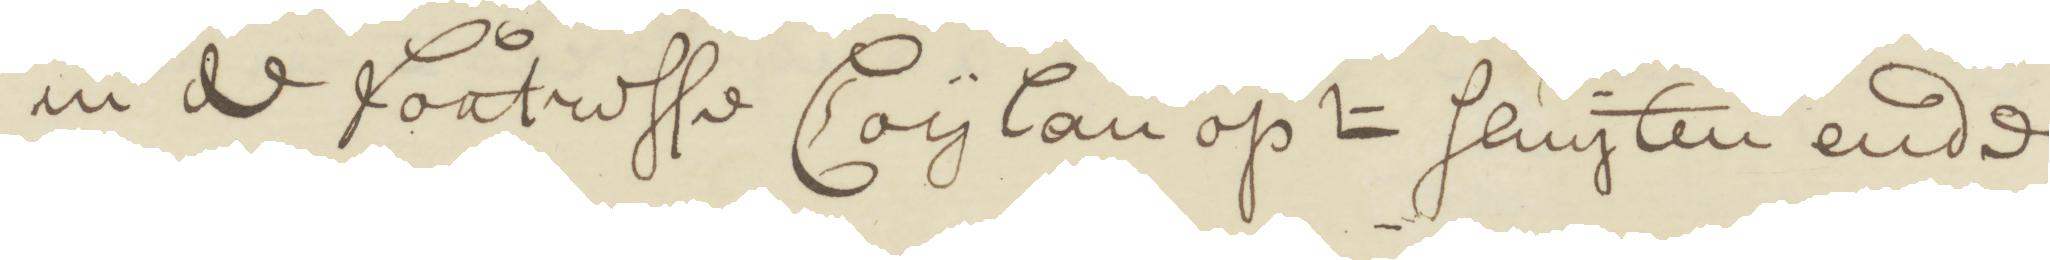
in de fortresse Coijlan op ’t sluijten ende
